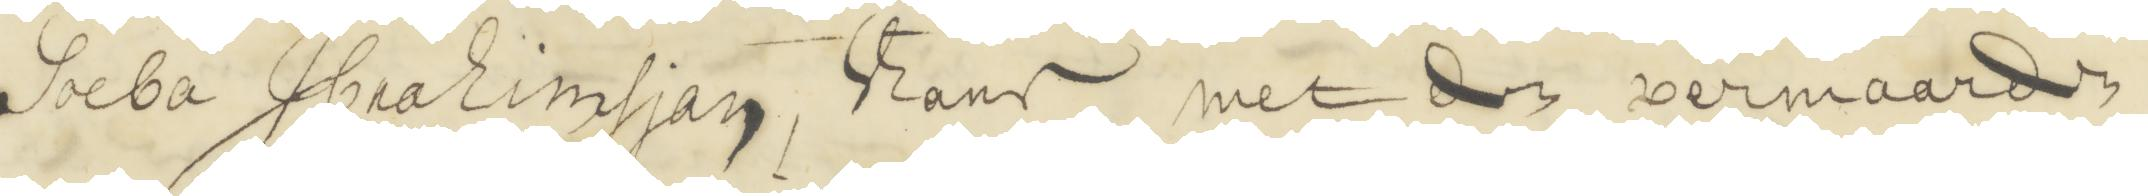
Soeba Jbrahimsjan, thans met den vermaarden
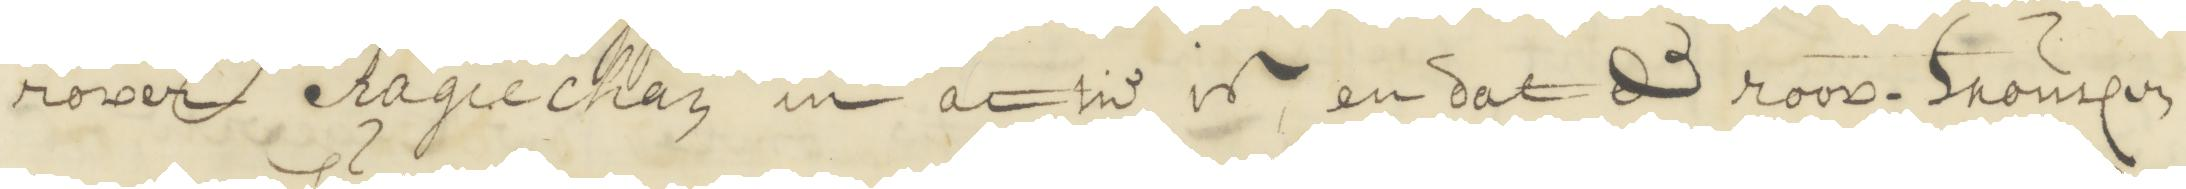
rover Ragiechan in actie is, en dat de roov. troupen
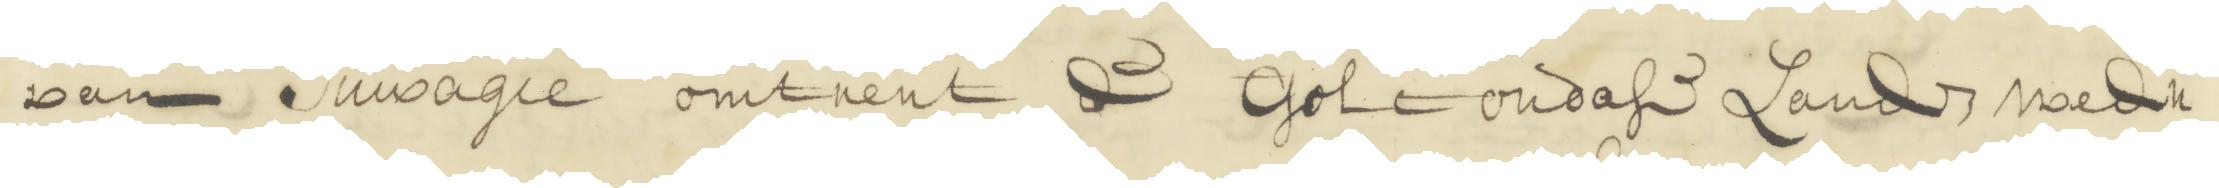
van Suwagie omtrent de Golcondase Landen weder
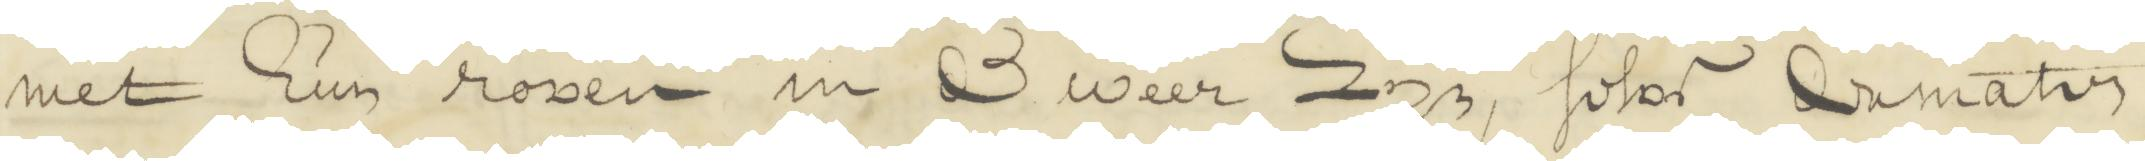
met hun roven in de weer zijn, selvs dermaten
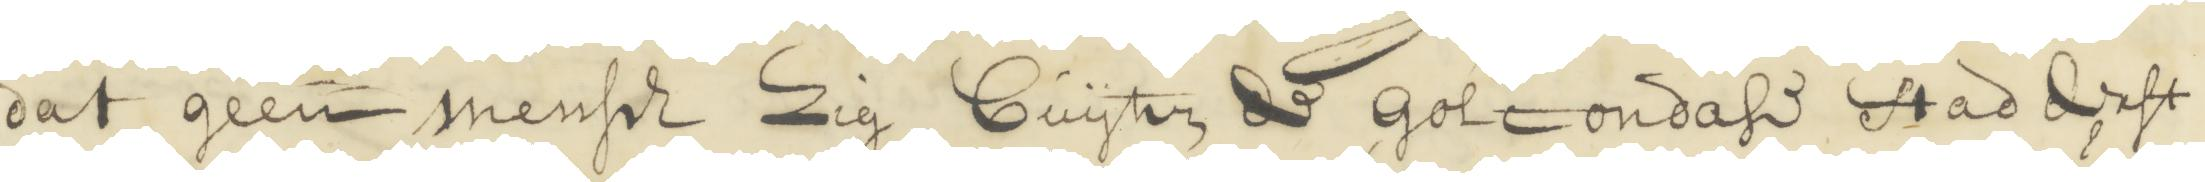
dat geen mensch zig buijten de golcondase stad derst
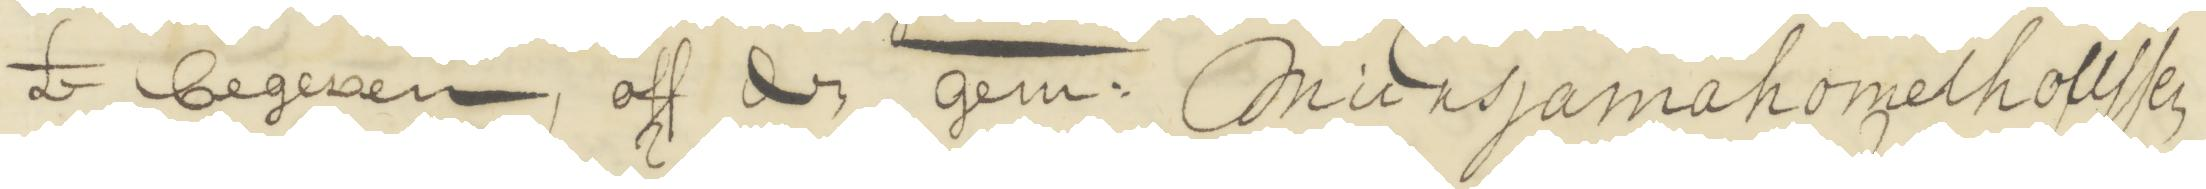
te begeven, off den gem: Miersjamahomelhoussen
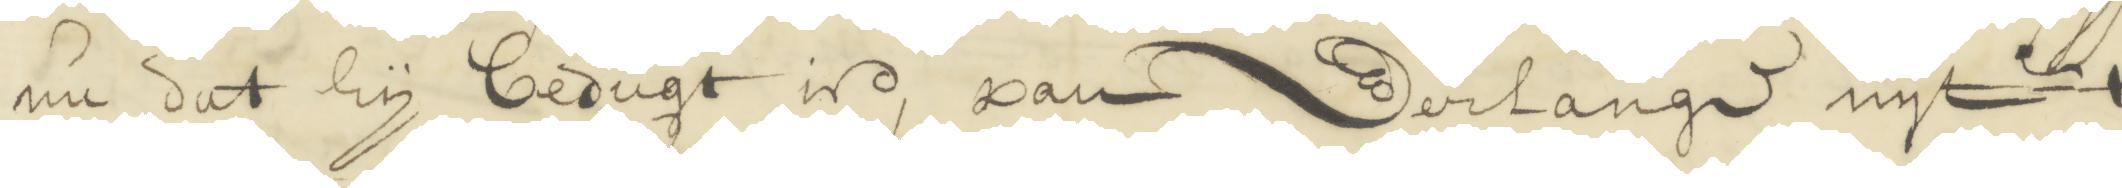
nu dat hij bedugt is, van Eerlange uijt '
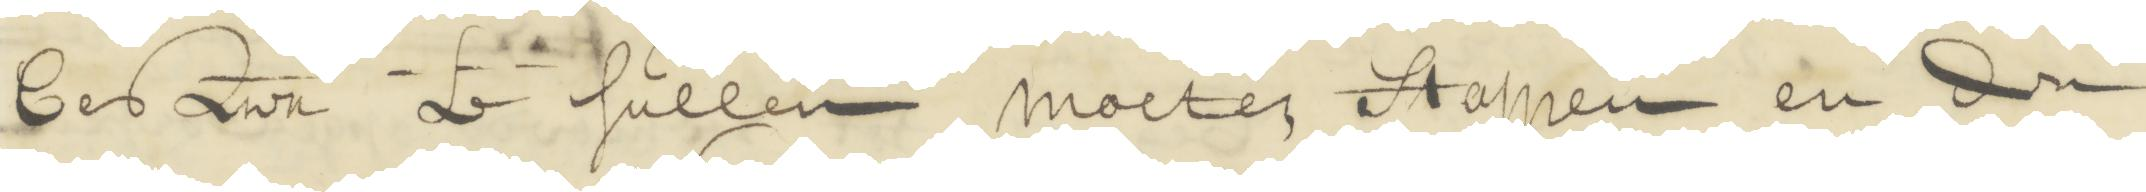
bestier te sullen moeten stappen en den
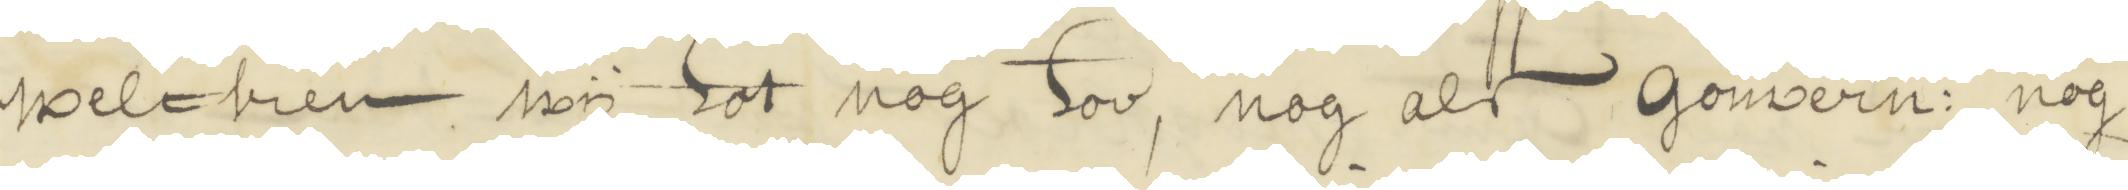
welcken wij tot nog toe, nog als gouvern:r, nog
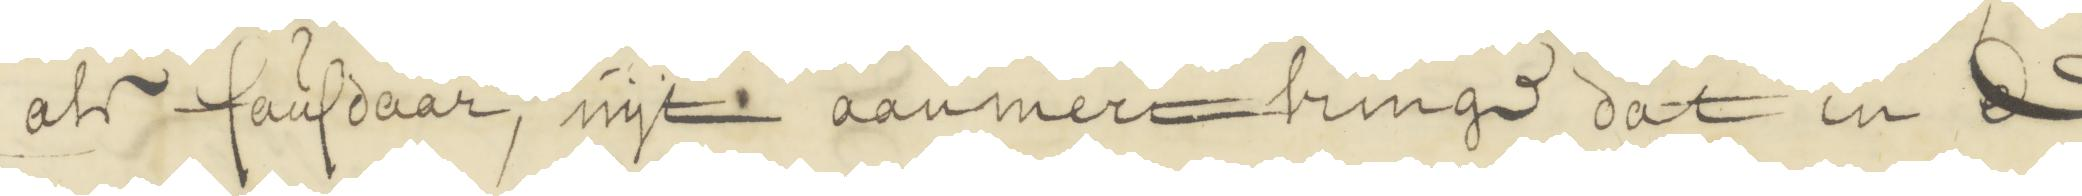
als fausdaar, uijt aanmerckinge dat in de
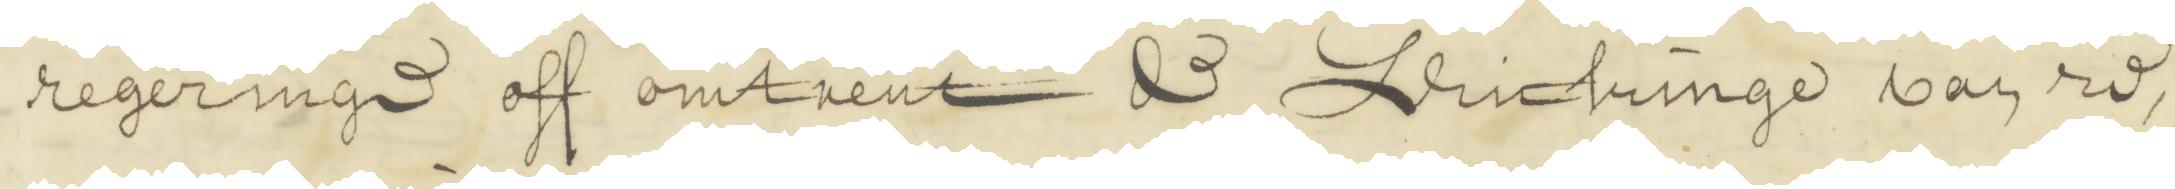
regeringe off omtrent de vrickinge van re„
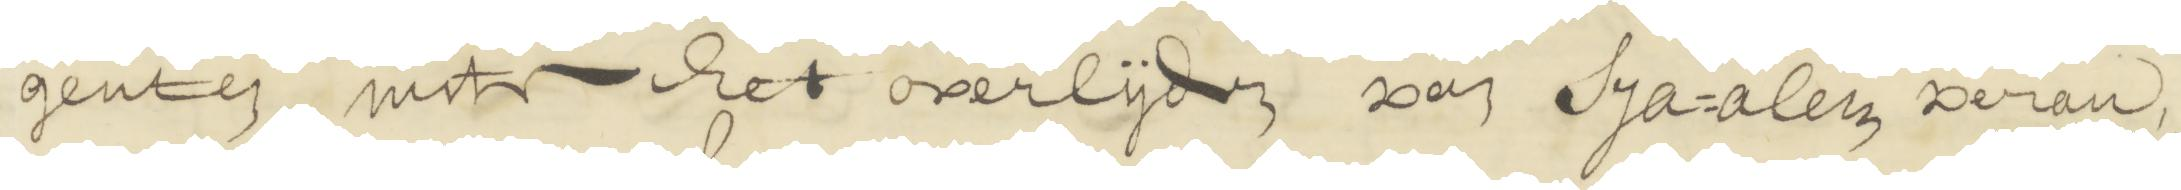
genten, mits het overlijden van sja=alem veran„
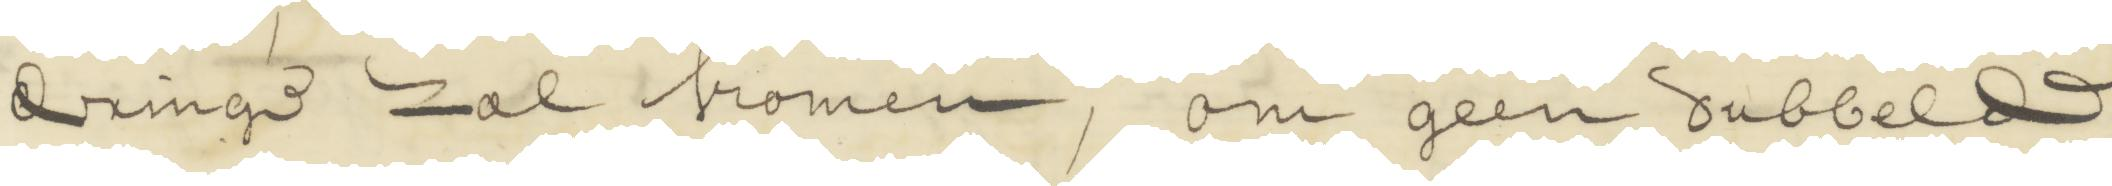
deringe zal komen, om geen dubbelde
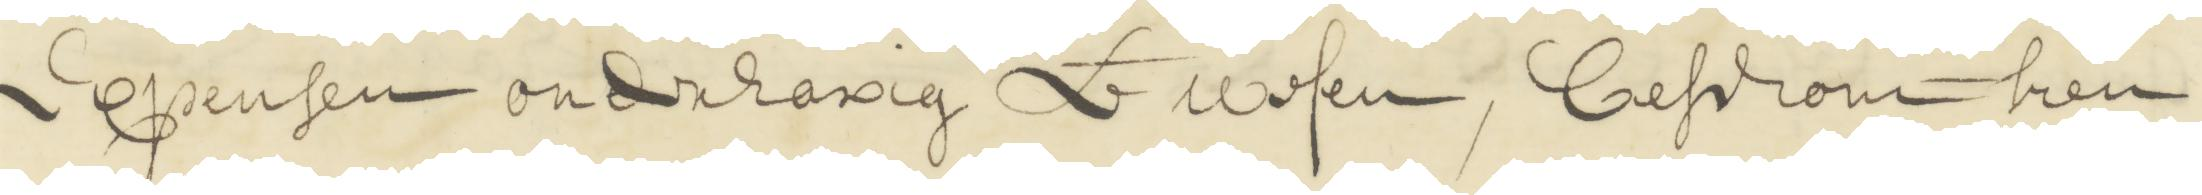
Expensen onderhavig te wesen, beschoncken
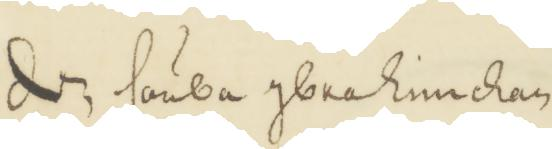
dem souba jbrahimchan
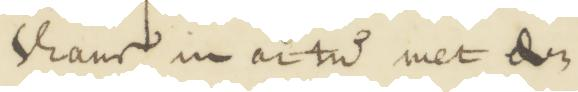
thans in actie met den
